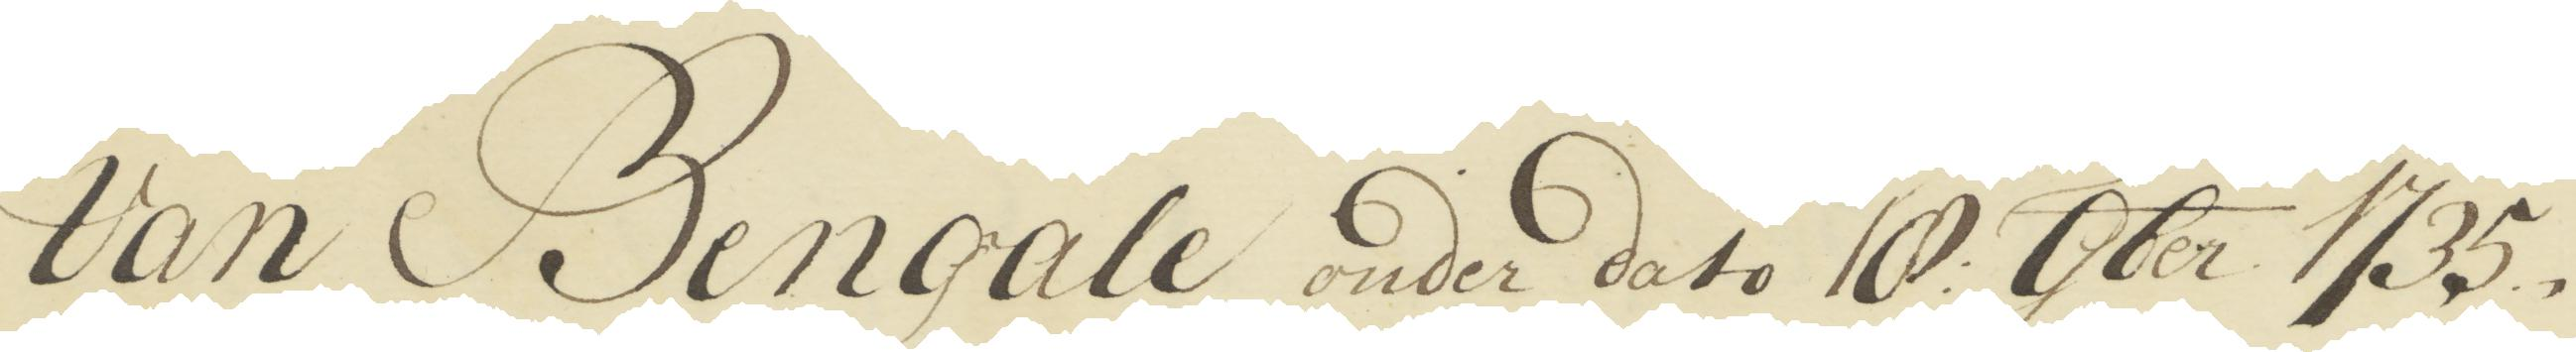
Van Bengale onder dato 18:' 9ber 1735.
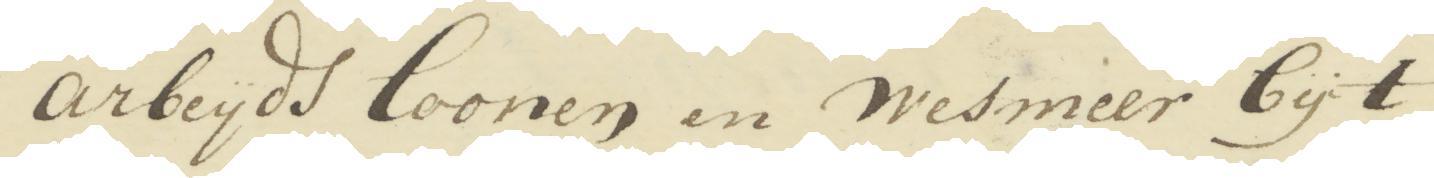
arbeijds loonen en wesmeer bij ’t
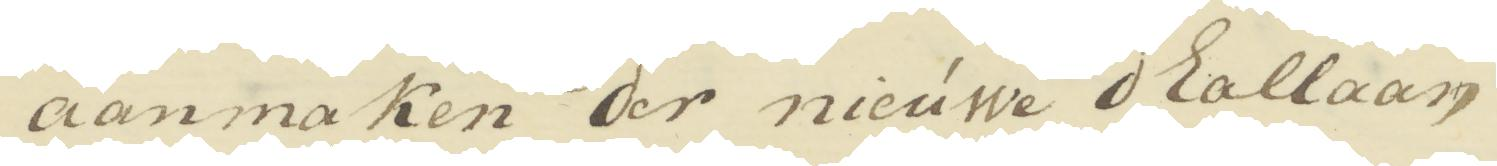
aanmaken der nieuwe dhallaan
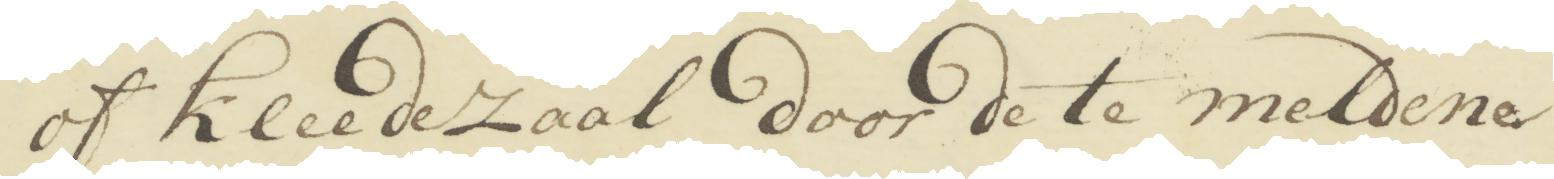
of kleedezaal door de te meldene
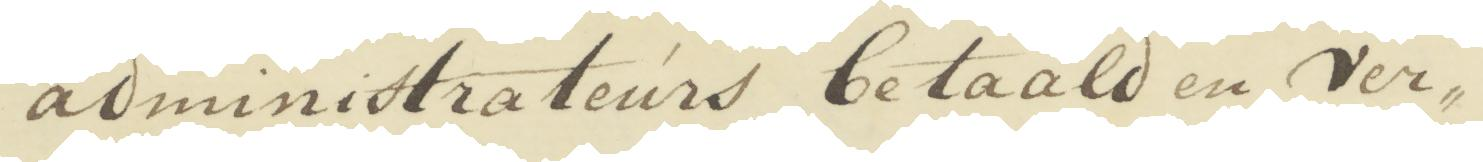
administrateurs betaald en ver„
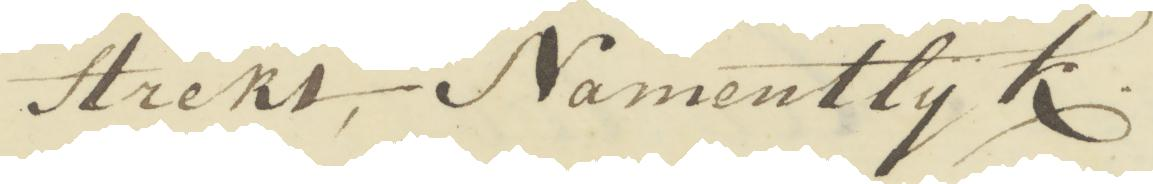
strekt, Namentlijk
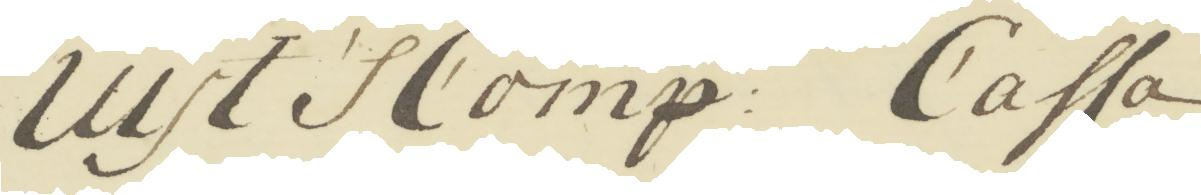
uijt ’s Comp:s Cassa
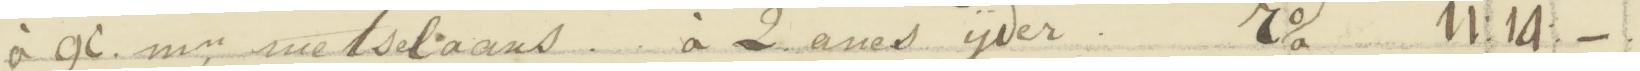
à 95. m,n metselaars . . à 2. anes ijder . ro/a 11:14:—.
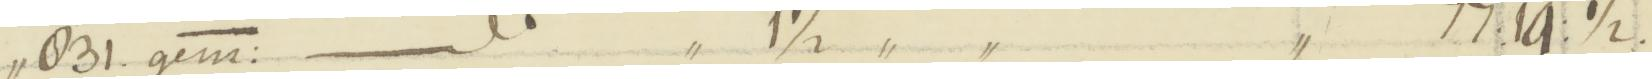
„ 831. gem: _o „ 1½ „ „ „ 77:14:½.
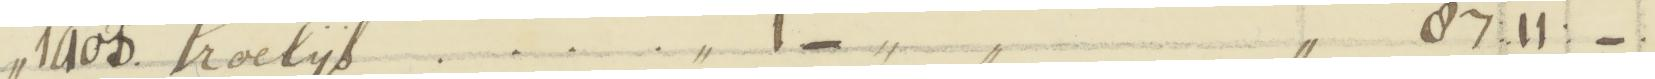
„1408. koelijs . . . . „ 1 – „ „ „ 87:11—.
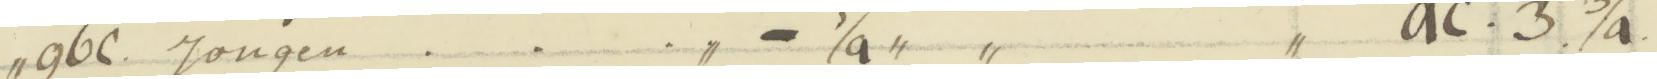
„965. Jongen . . . „ – ¾ „ „ „ 45.3.¾.
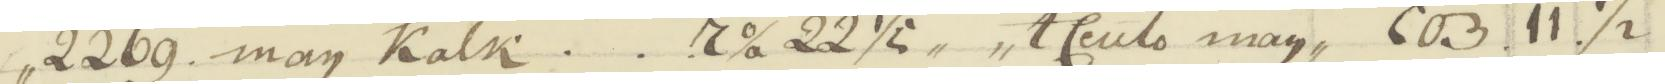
„2269. man kalk . . . ro/a 22 1/5 „ „ t Cents man „ 503.11.½
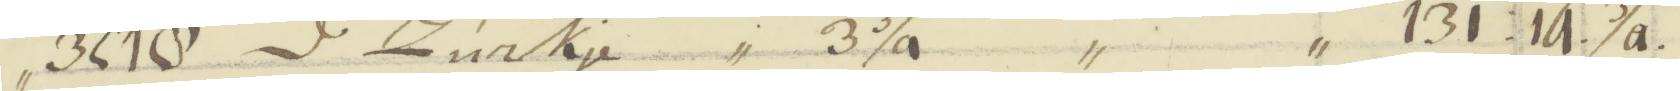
„3518 _o zurkje „ 3¾ „ „ 131:14.¾.
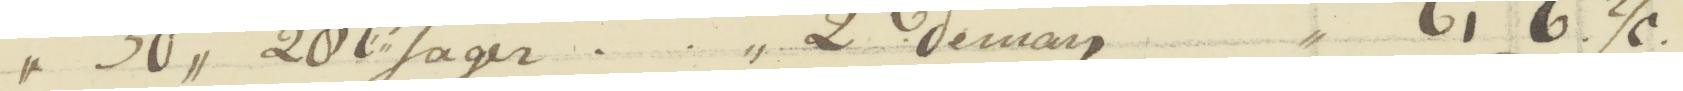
„ 30 „ 281„ Jager . . „ 2 deman „ 61 6. 2/5.
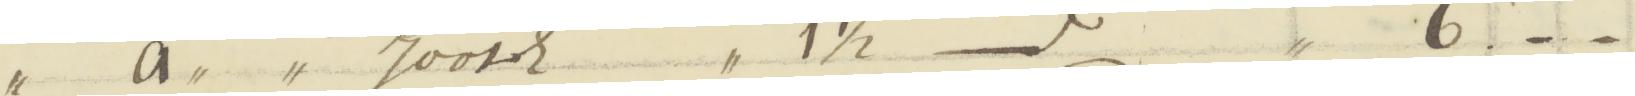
„ 4 „ „ Jooth „ 1½ _o „ 6.–.–
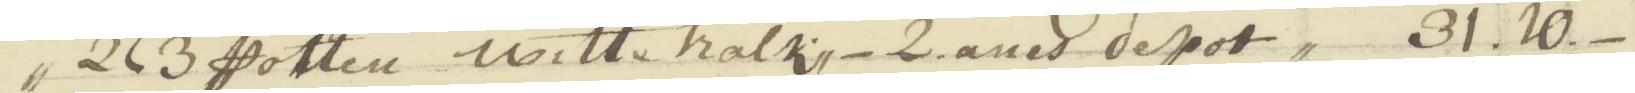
„ 253 potten witte kalk „ – 2. anes de pot „ 31. 10.–
